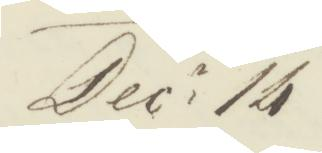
Dec:r 14
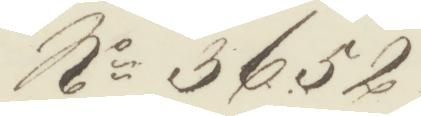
N=o 3652
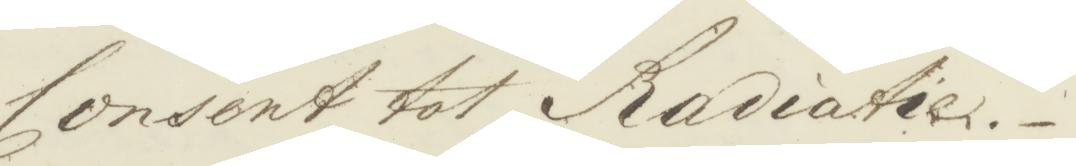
Consent tot Radiatie.-
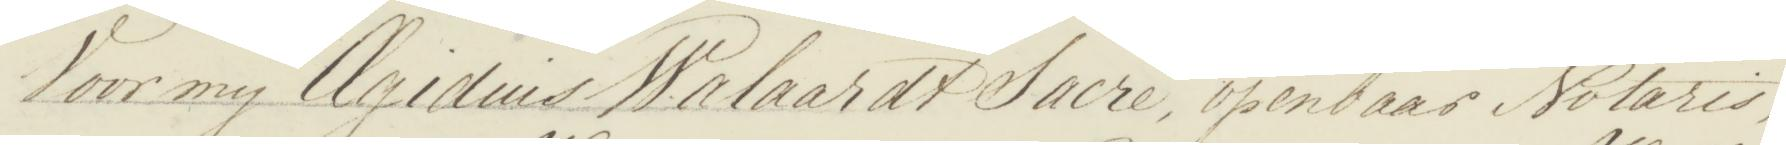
Voor my AEgidius Walaardt Sacré, openbaar Notaris,
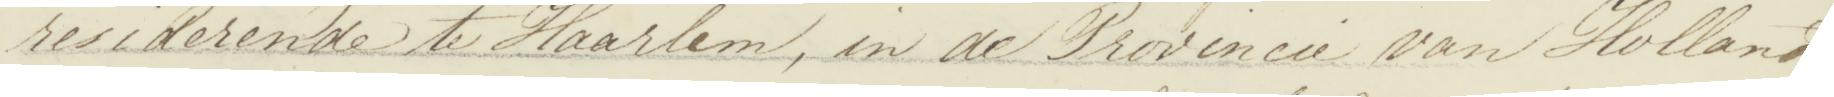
residerende te Haarlem, in de Provincie van Holland,
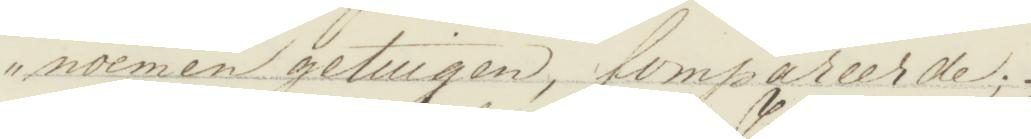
„noemen getuigen, Compareerde;
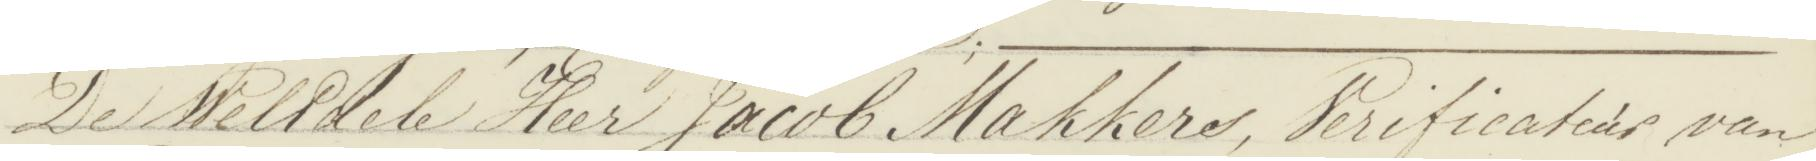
De WelEdele Heer Jacob Makkers, Verificateur van
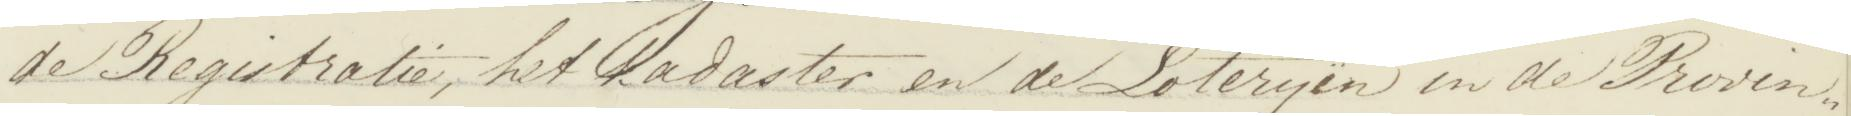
de Registratie, het kadaster en de Loterijen in de Provin„
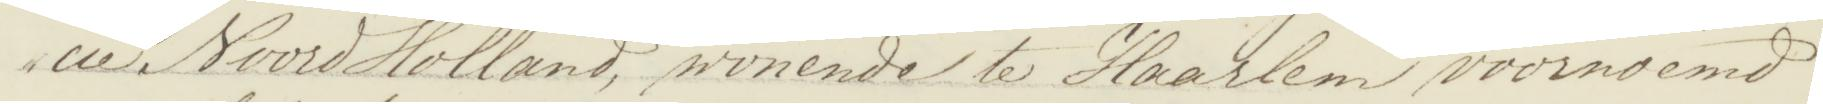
„cie Noord Holland, wonende te Haarlem voornoemd
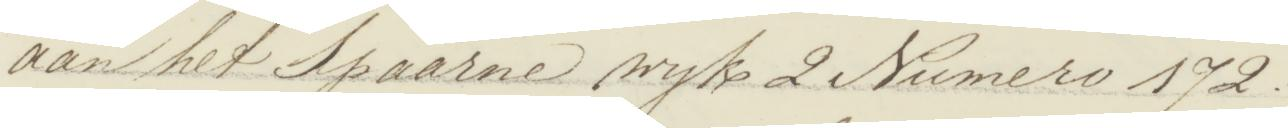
aan het Spaarne wyk 2 Numero 172.
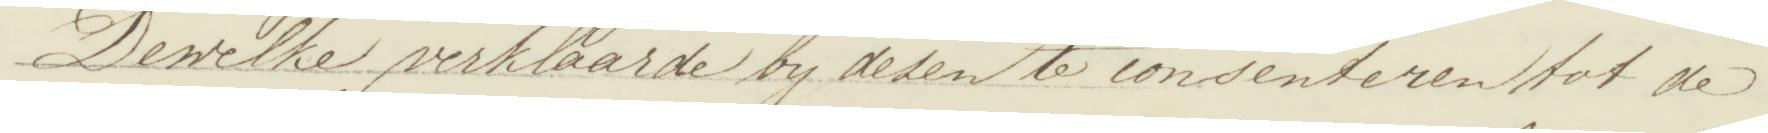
Dewelke verklaarde by dezen te consenteren tot de
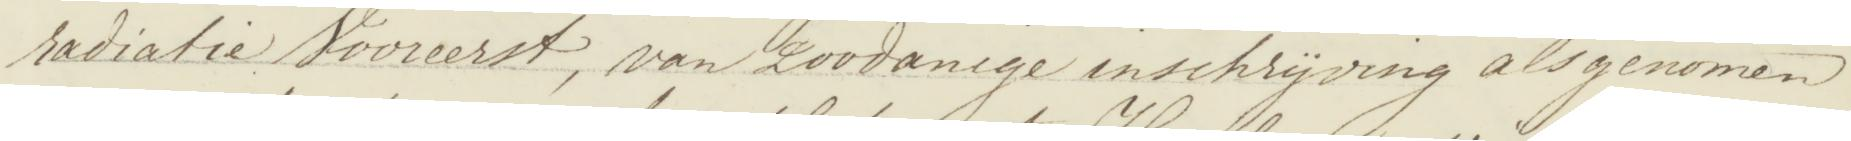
radiatie Vooreerst, van zoodanige inschrijving als genomen
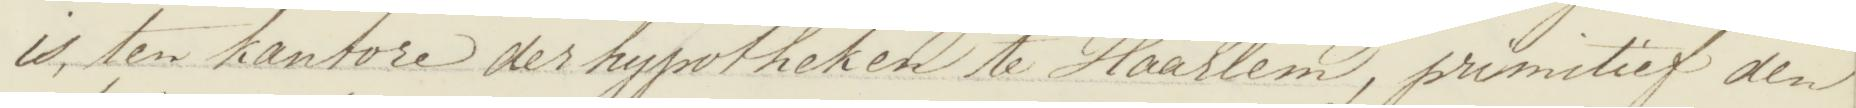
is, ten kantore der hypotheken te Haarlem, primitief den
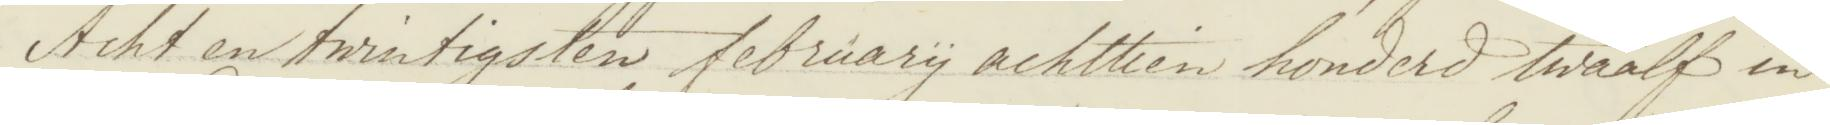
Acht en twintigsten februarij achttien honderd twaalf in
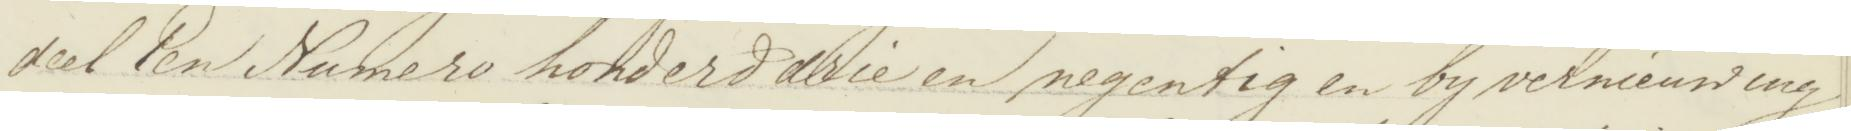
deel Een Numero honderd drie en negentig en by vernieuwing
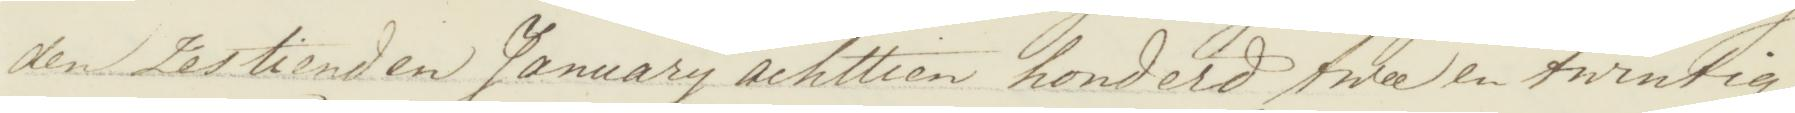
den Zestienden January achttien honderd twee en twintig
